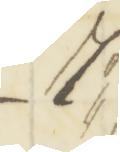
r„o
